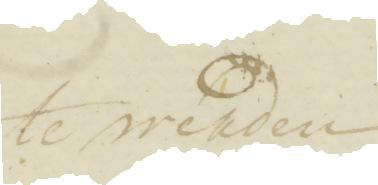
te werden
